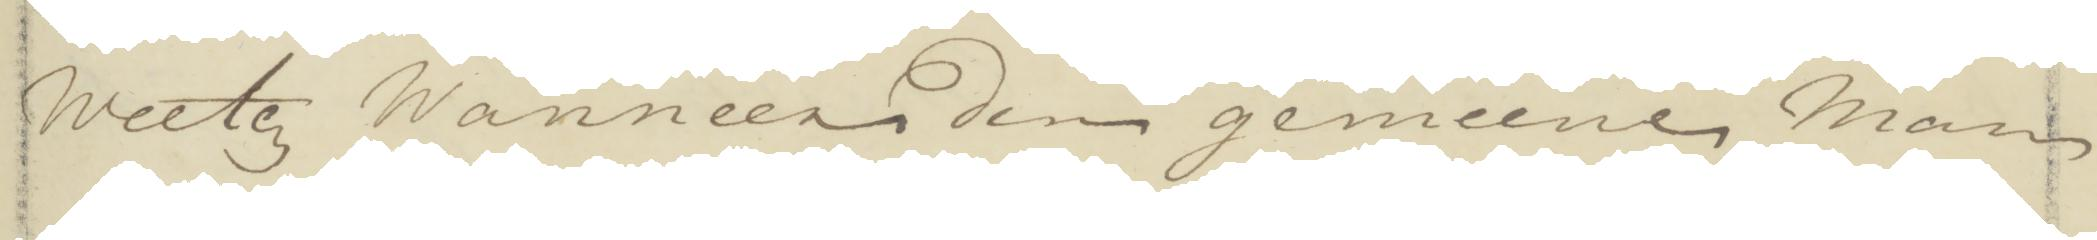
weeten wanneer den gemeene man
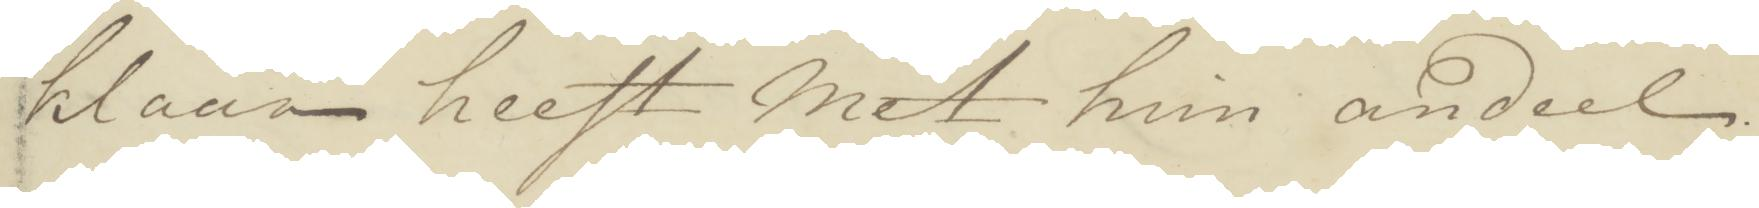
klaar heeft met hun andeel.
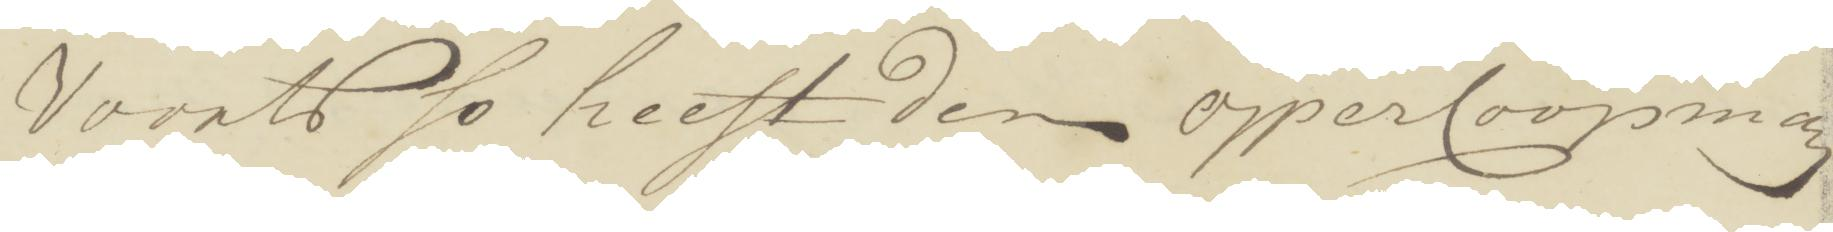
Voorts so heeft den oppercoopman
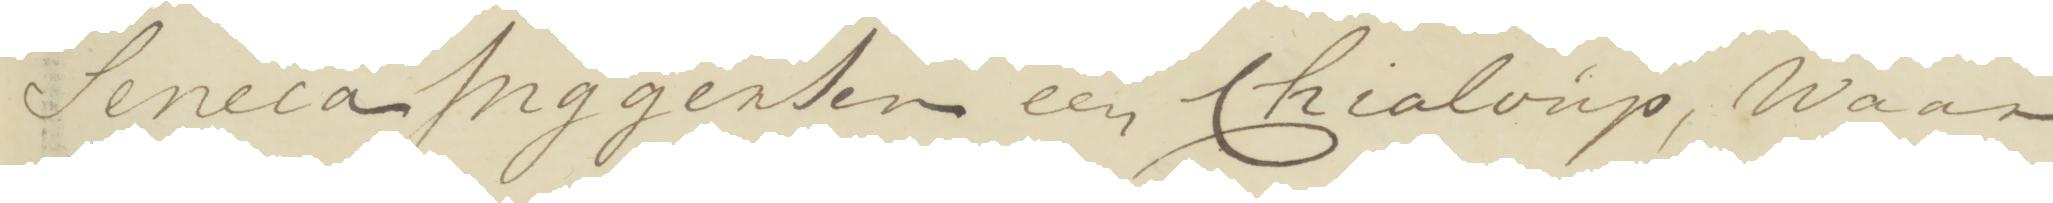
seneca Jnggersen een Chialoup, waar
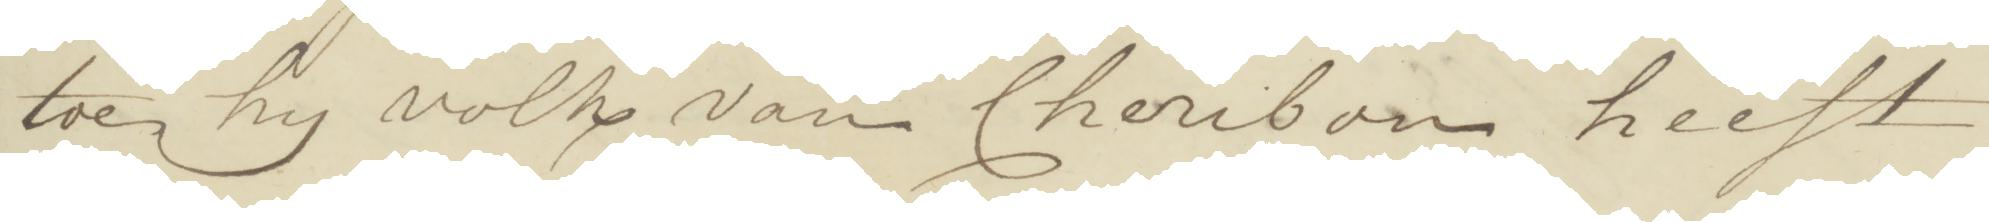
toe hy volk van Cheribon heeft
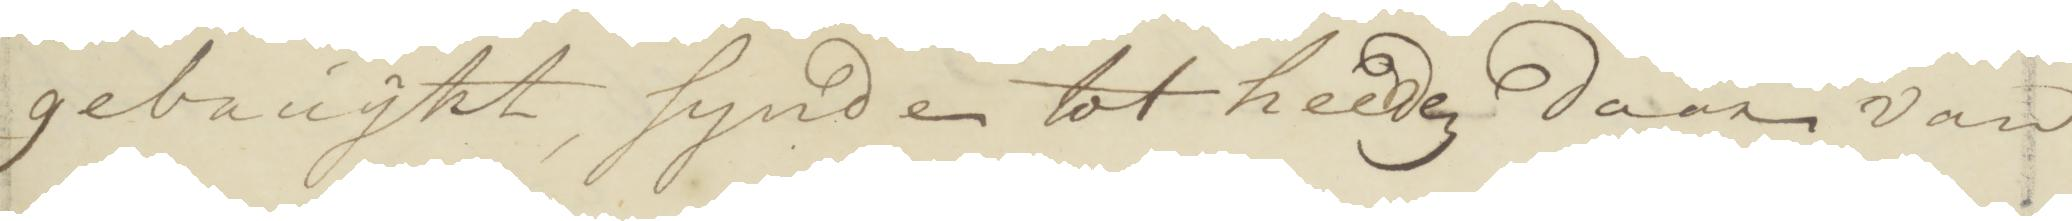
gebruijkt, synde tot heeden daar van
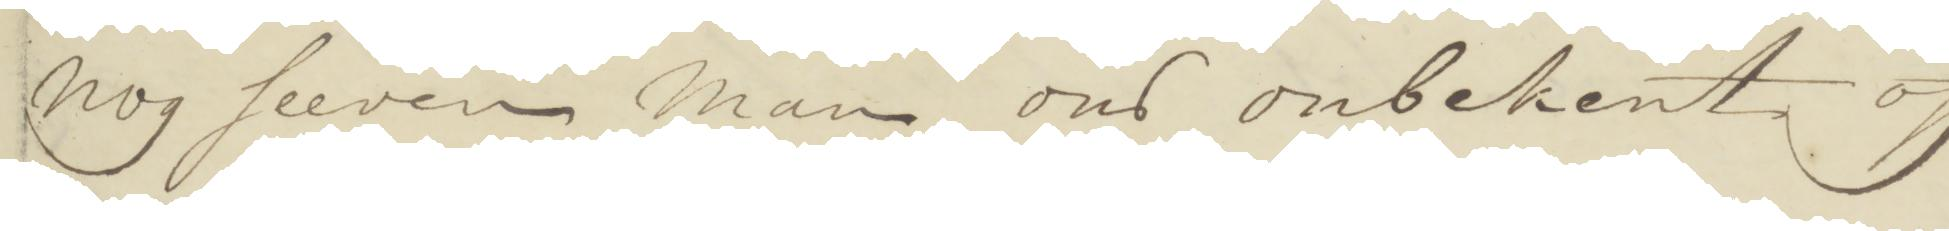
nog seeven man, ons onbekent off
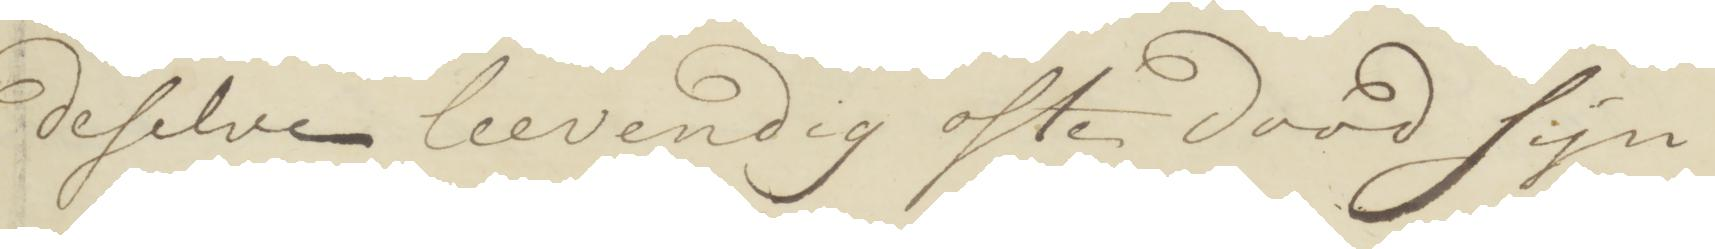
deselve leevendig ofte dood sijn
